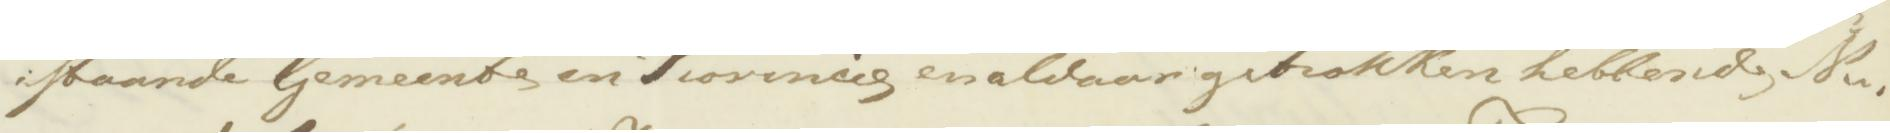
„staande Gemeente en Provincie en aldaar getrokken hebbende Nu,
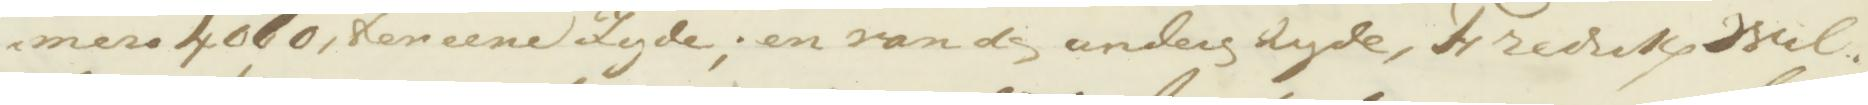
„mero 4060, ter eene zyde, en van den anderen zyde, Fredrik Wil,
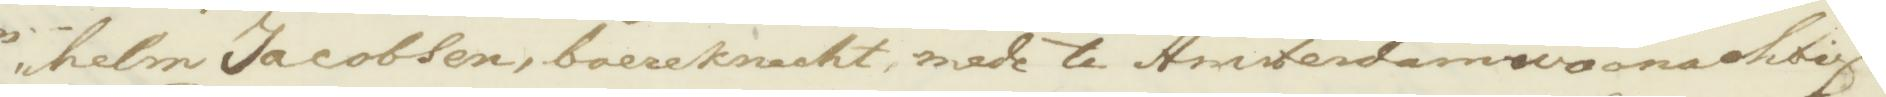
helm Iacobsen, boereknecht, mede te Amsterdam woonachtig
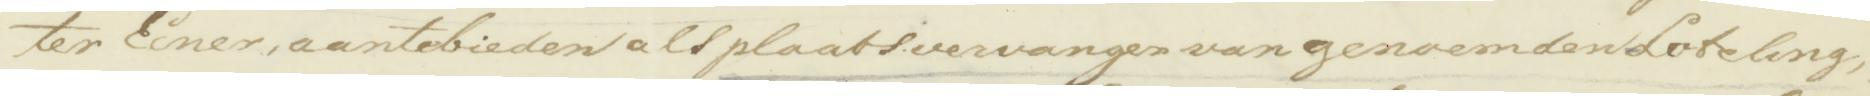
ter Eener, aantebieden als plaatsvervanger van genoemden Loteling,
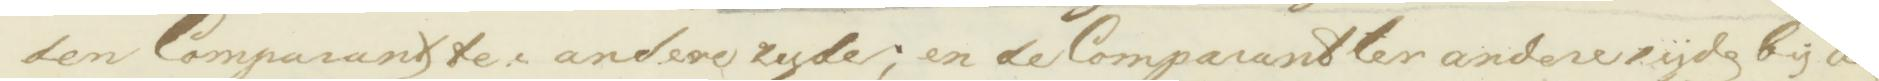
den Comparant ter andere zyde, en de Comparant ter andere zijde bij de
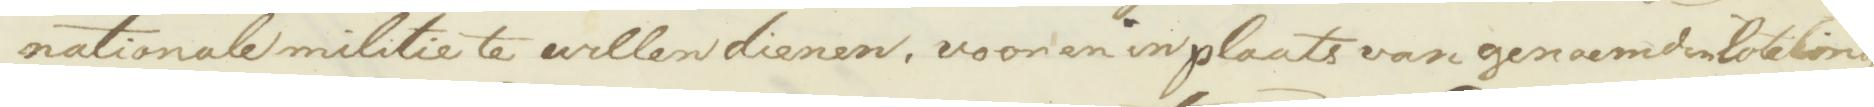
nationale militie te willen dienen, voor en in plaats van genoemden loteling
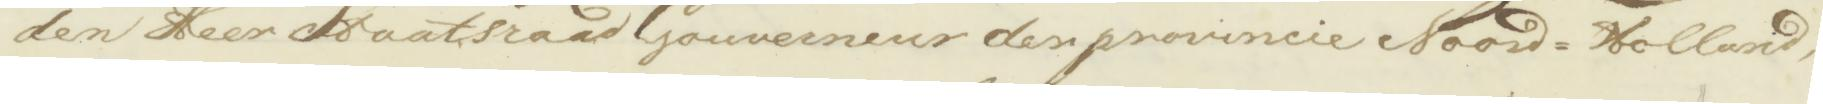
den Heer Staatsraad Gouverneur der provincie Noord-Holland,
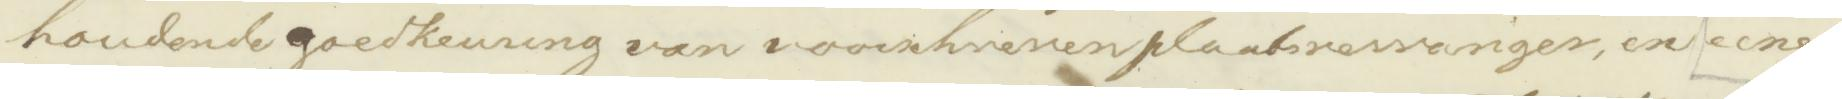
houdende goedkeuring van voorschreven plaatsvervanger, en eene
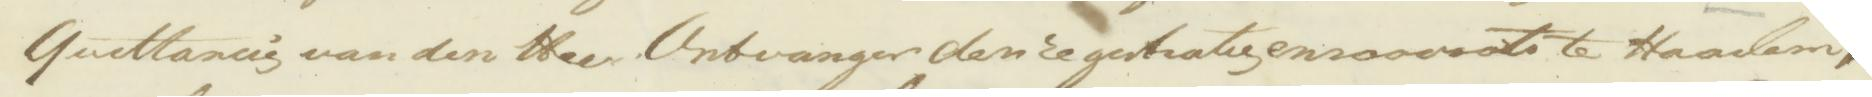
Quittantie van den Heer Ontvanger der registratie en zoovoorts te Haarlem,
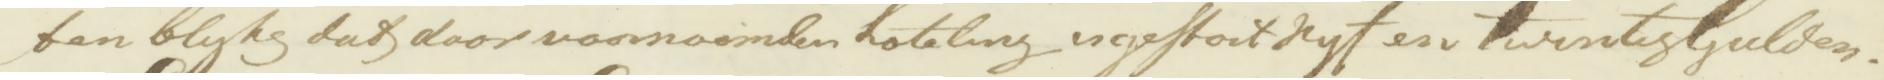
ten blyken dat door voornoemden loteling is gestort vyf en twintig Gulden.
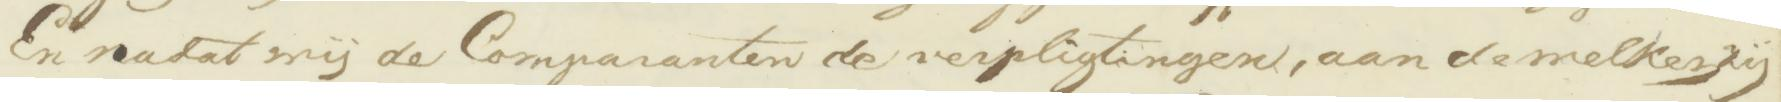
En nadat mij de Comparanten de verpligtingen, aan de welken zij
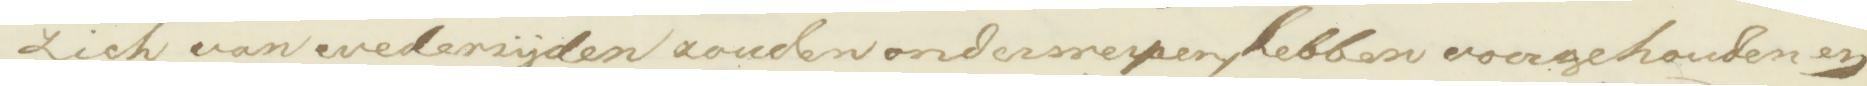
zich van wederzijden zouden onderwerpen, hebben voorgehouden en
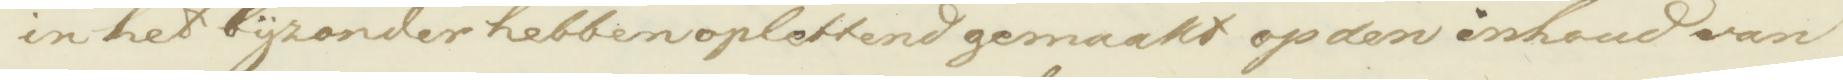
in het bijzonder hebben oplettend gemaakt op den inhoud van
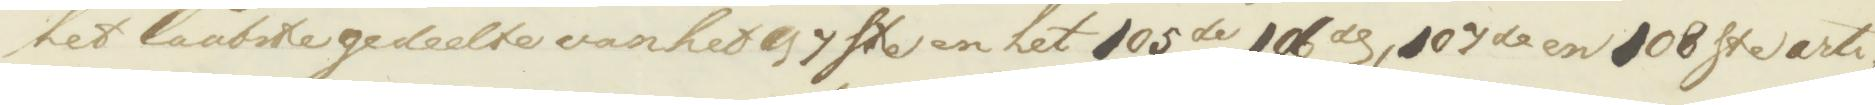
het laatste gedeelte van het 97ste en het 105de, 106de, 107de en 108ste arti
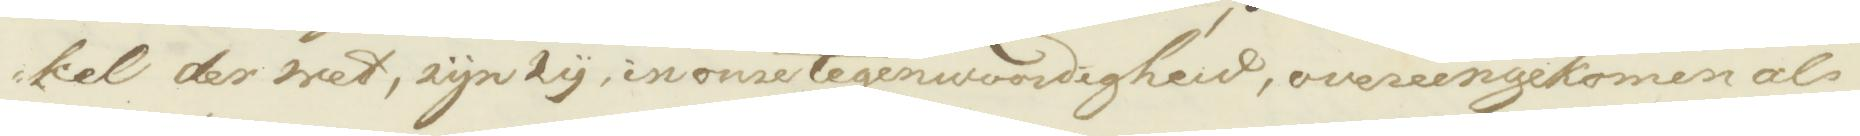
„kel der wet, zijn zij, in onze tegenwoordigheid, overeengekomen als
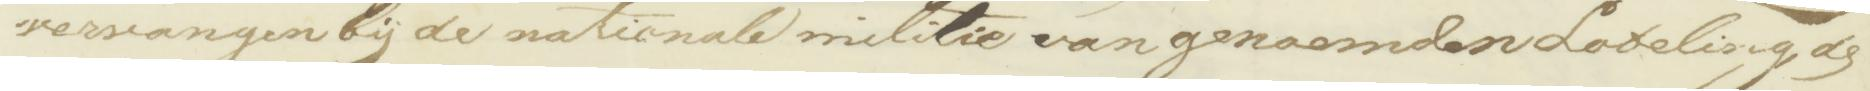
vervangen bij de nationale militie van genoemden Loteling, de
